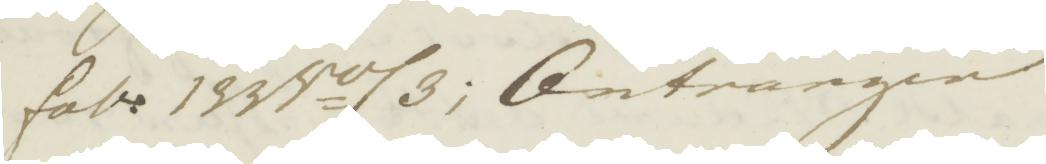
fol: 133 V=o C3; Ontvangen
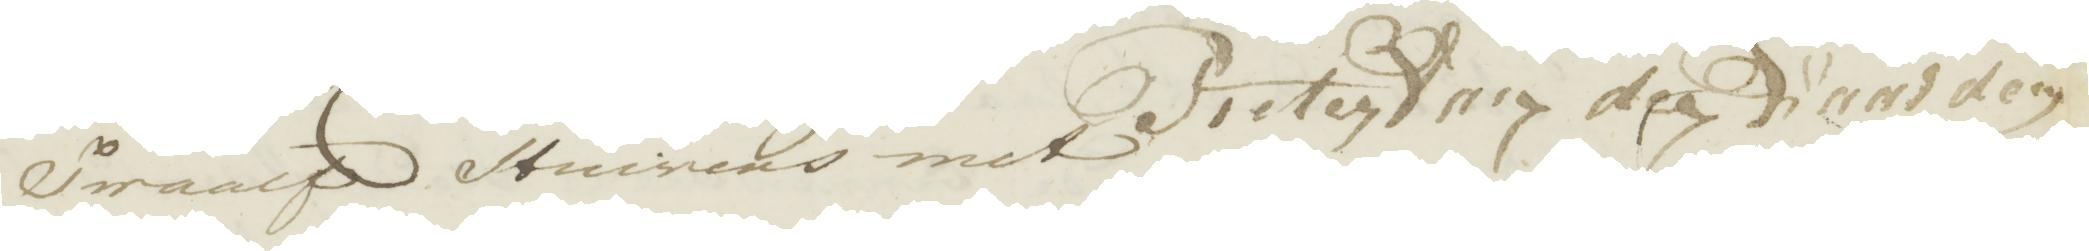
Twaalf Stuivers met Pieter Van den Waarden
